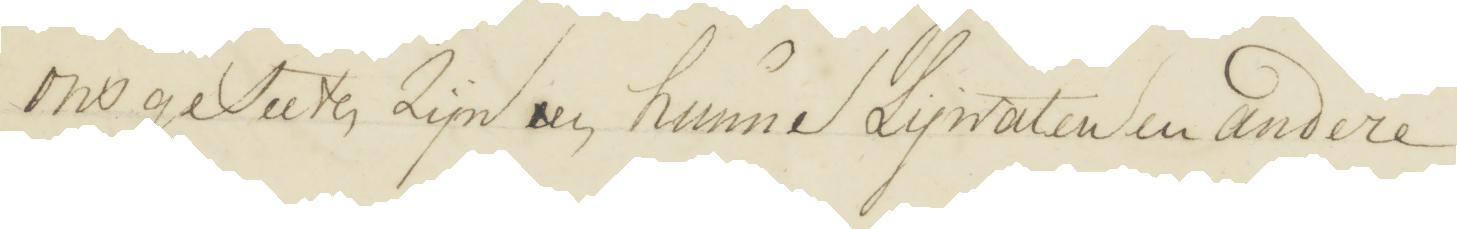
ons geseeten zijn een hunne Lijwaten en andere
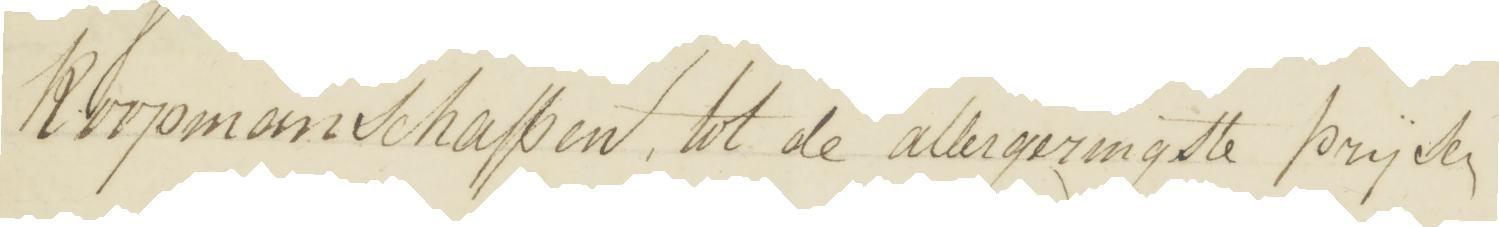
Koopmanschappen, tot de allergeringste prijsen
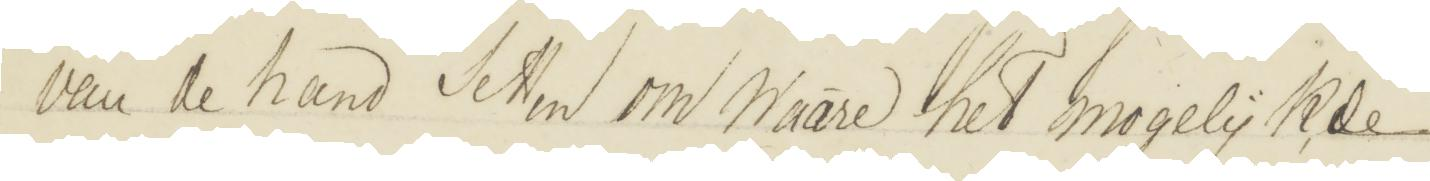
van de hand setten om waare het mogelijk, de
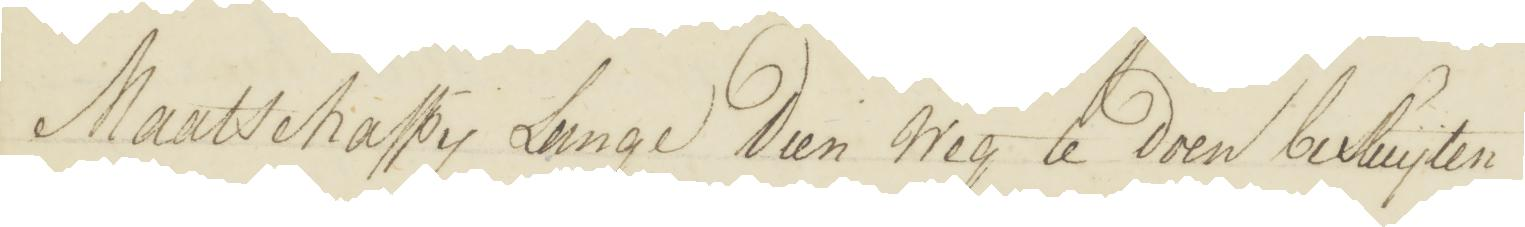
Maatschappij Lange dien weg te doen besluijten
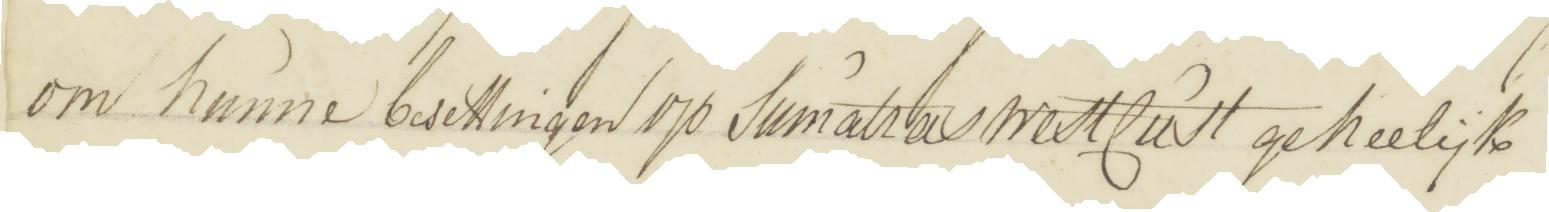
om hunne besettingen op Sumatras West Cust geheelijk
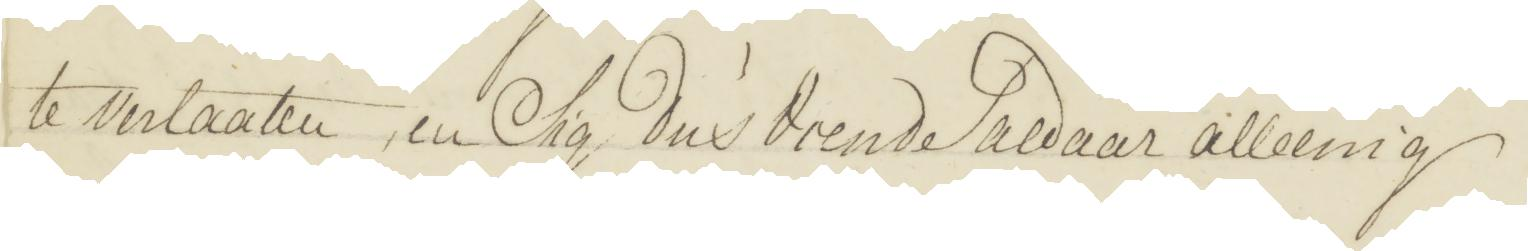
te verlaaten, en sig dus doende aldaar alleenig
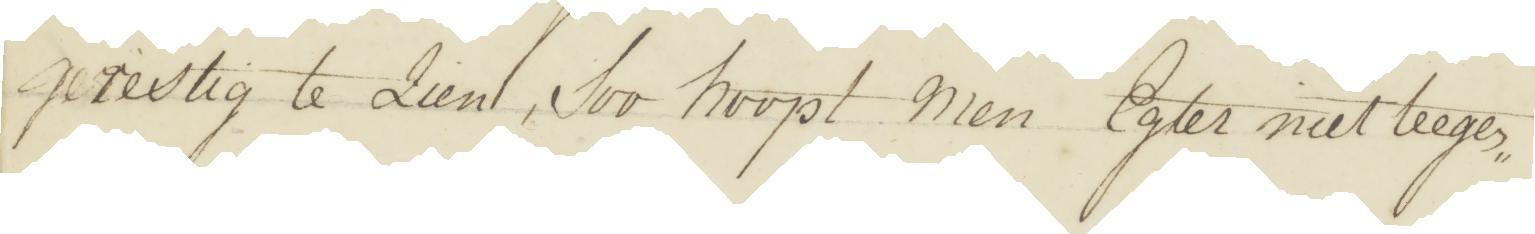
gevestig te zien, soo hoopt men Egter niet teegen„
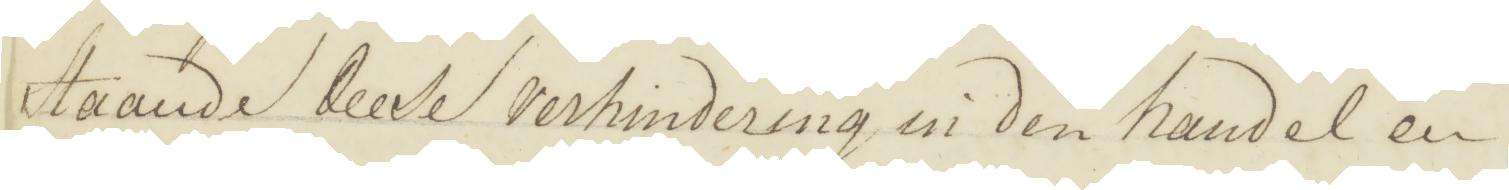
staande deese verhindering in den handel en
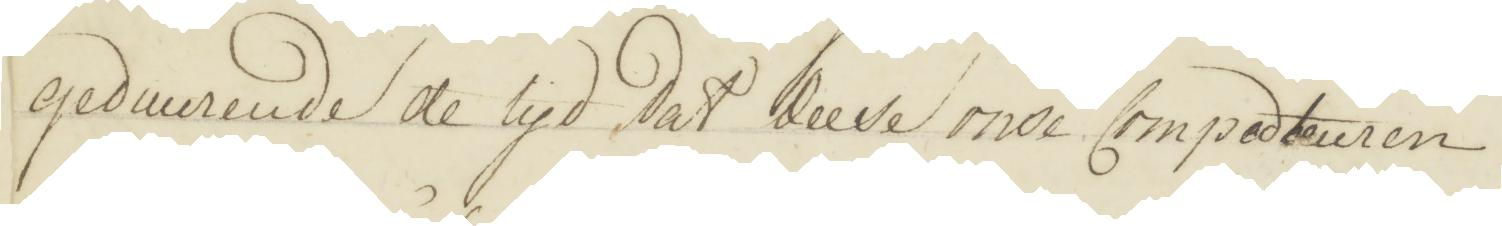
geduurende de tijd dat deese onse Compediteuren
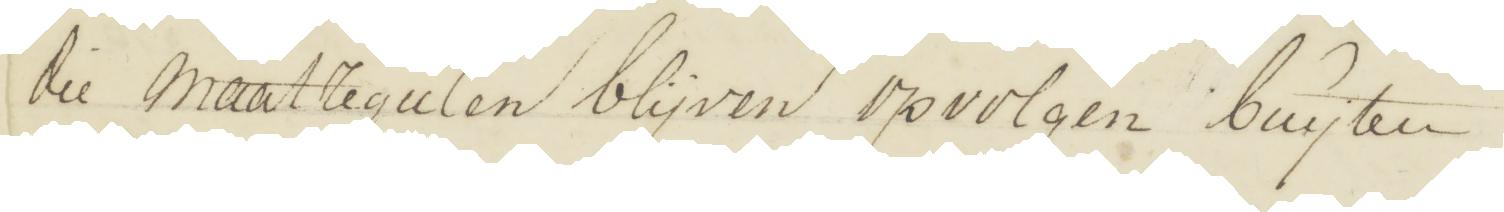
die maatregulen blijven opvolgen buijten
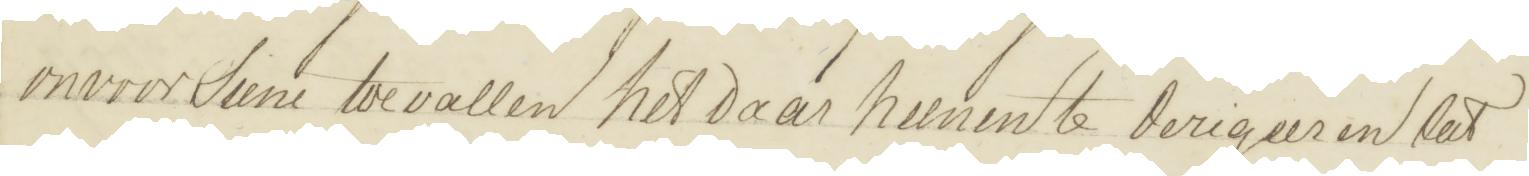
onvoorsiene toevallen het daar heenen te derigeeren dat
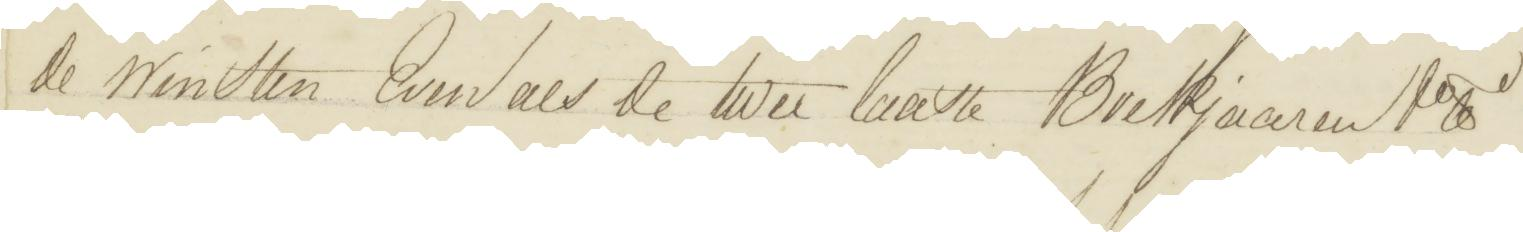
de winsten Even als de twee laaste Boekjaaren do Ao
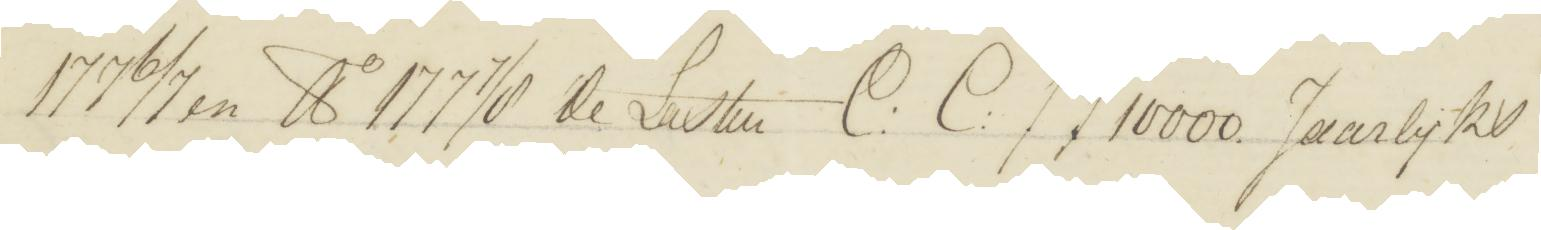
1776/7 en Ao 1777/8 de Lasten C: C: ƒ ƒ 10000. Jaarlijks
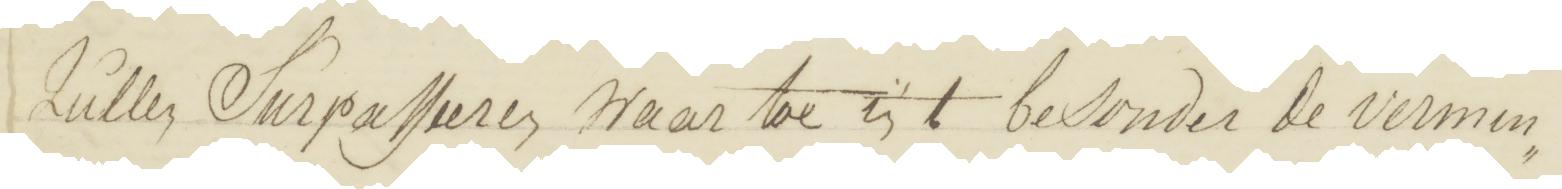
zullen Surpasseeren waar toe in ’t besonder de vermin„
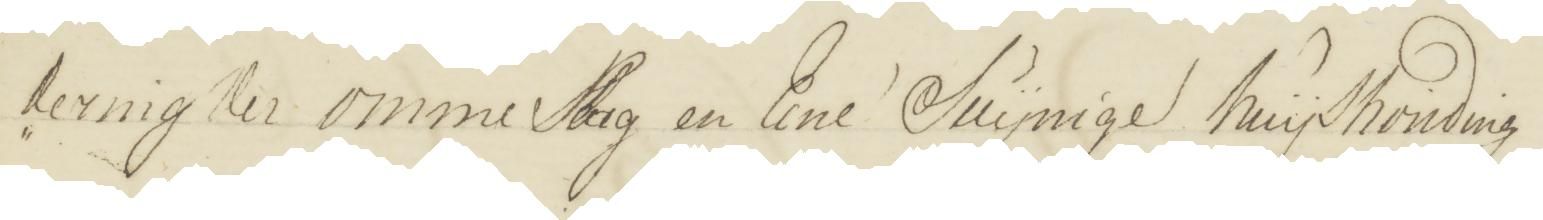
dering der ommeslag en Eene Suijnige huijshouding
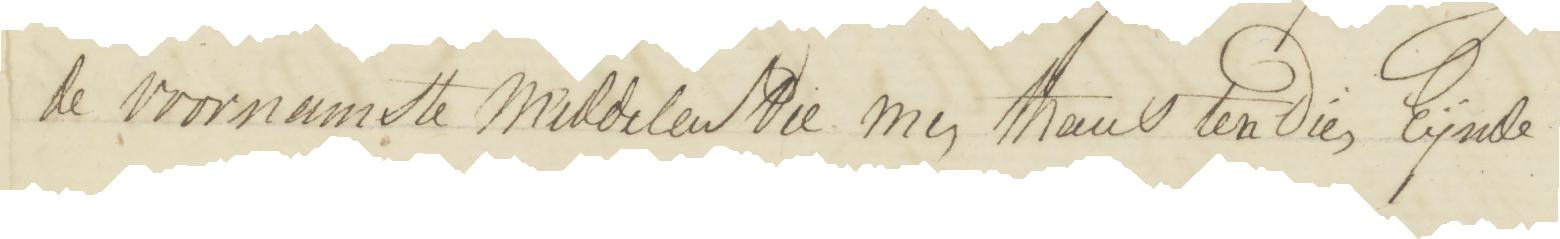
de voornamste middelen die men thans ten dien Eijnde
